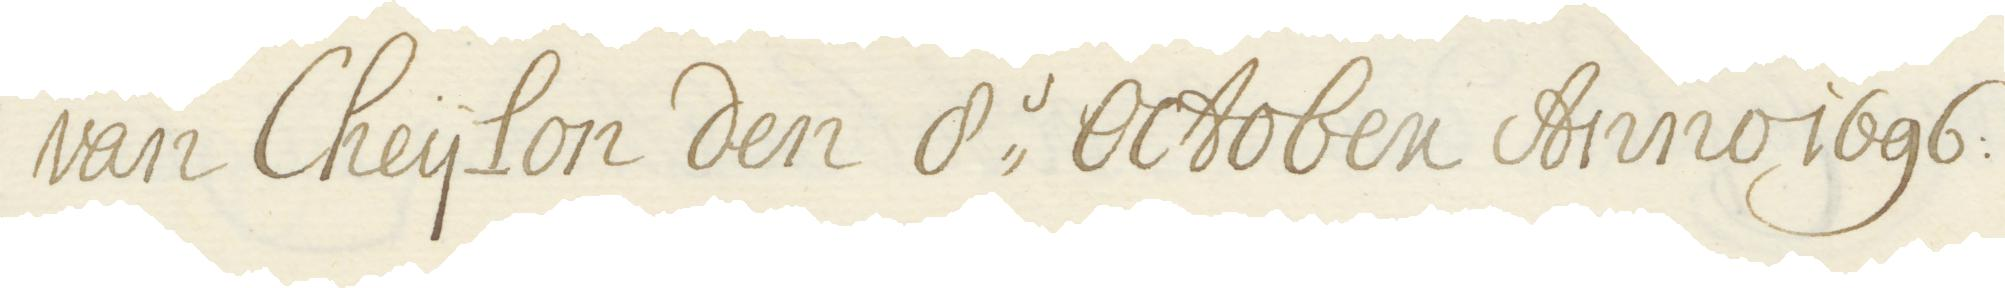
van Cheijlon den 8„e October Anno1696:
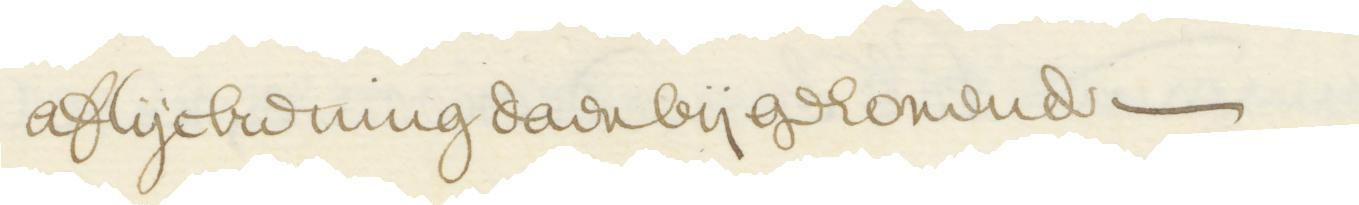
aftijckening daer bij gehorende —
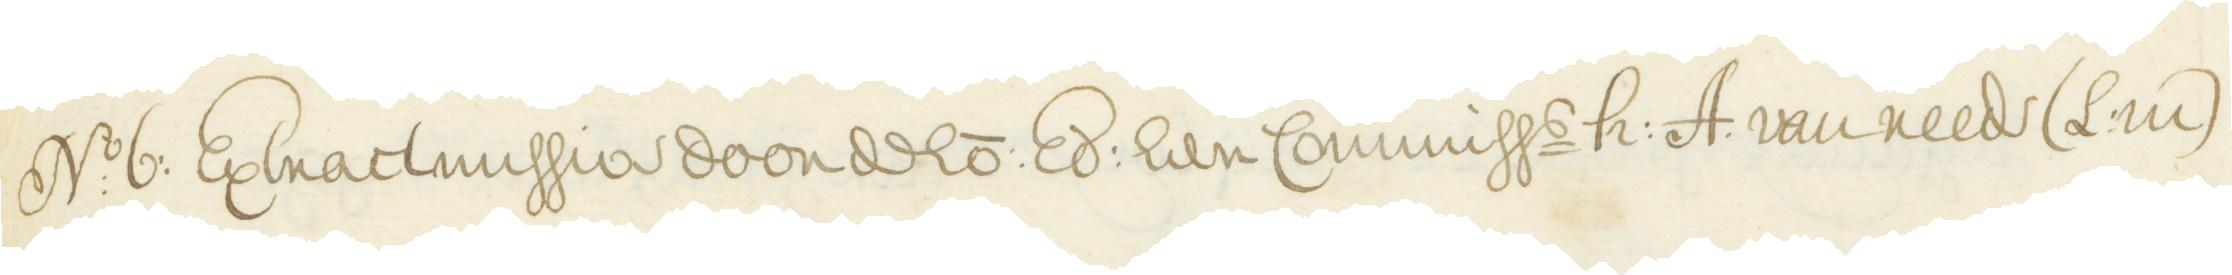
N:o 6. Extractmissive door deho: Ed: heer Commiss=s h: A: van reede (L:m)
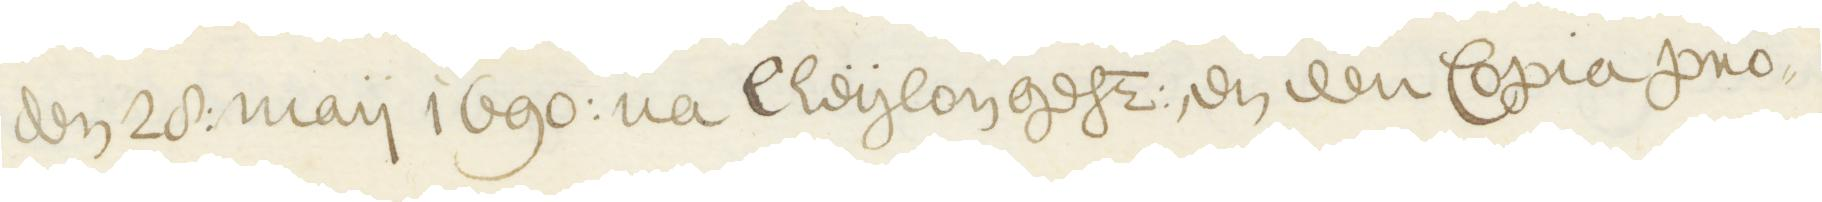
den 28: maij 1690: na Cheijlon gesz:, en een Copia pro„
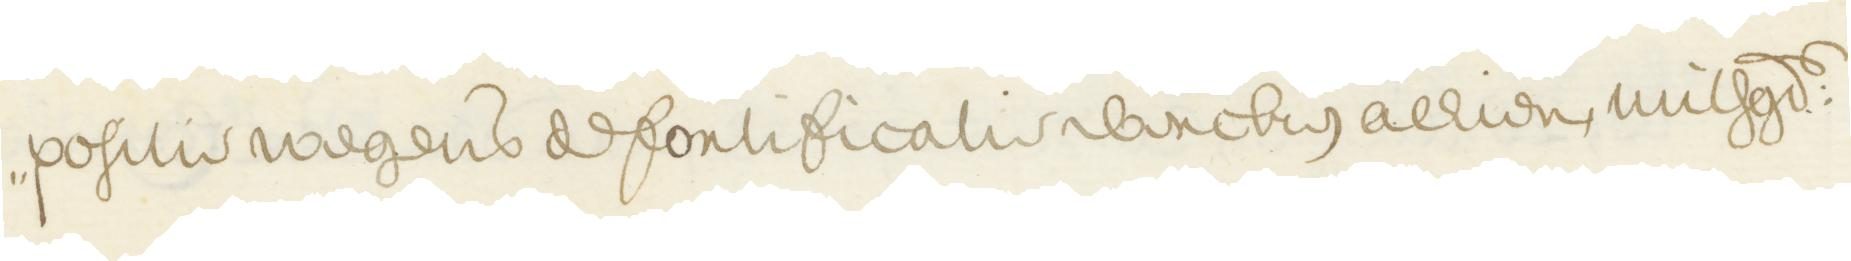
„positie wegens defortificatie wercken alhier, mitsgd:s
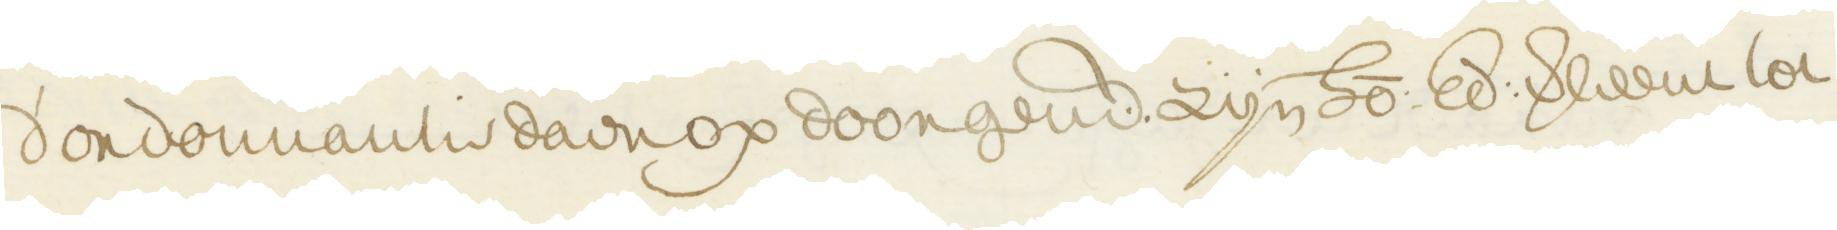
d'ordonnantie daer op door gem: zijn ho: Ed: verleent tot
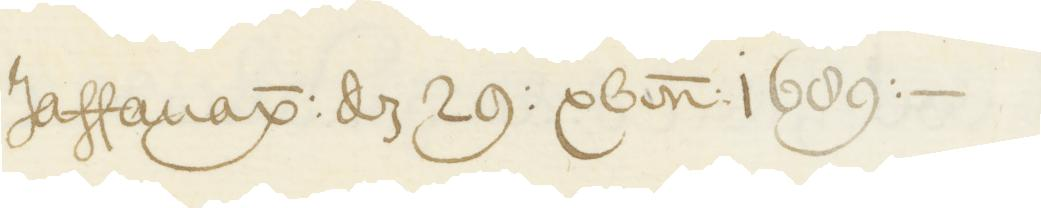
Jaffanap: den 29: xber: 1689: —
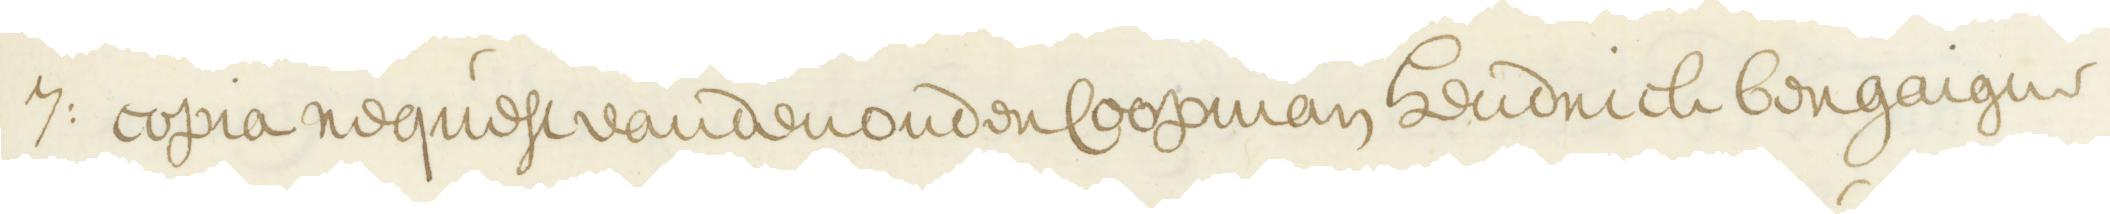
7: copia request vandenonderCoopman hendrick bergaigne
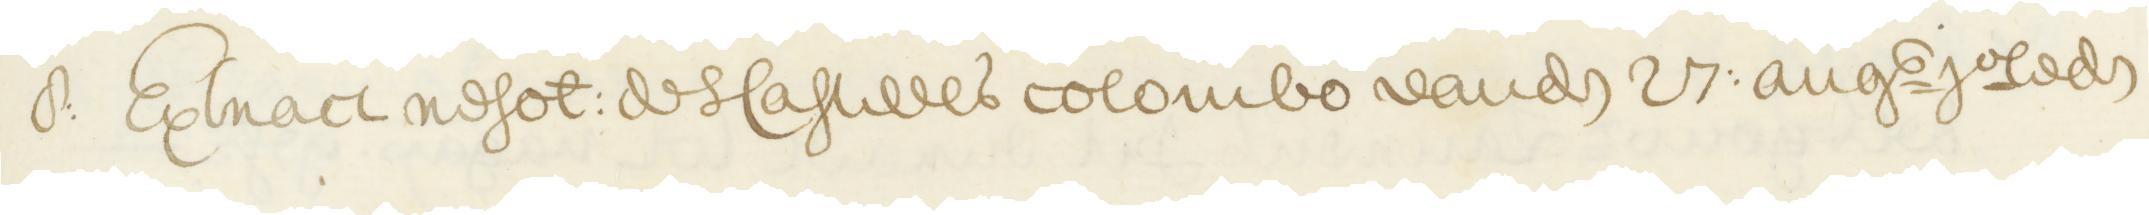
8: Extract resol: desCasteels colombo van den 27: aug=s j=oleden
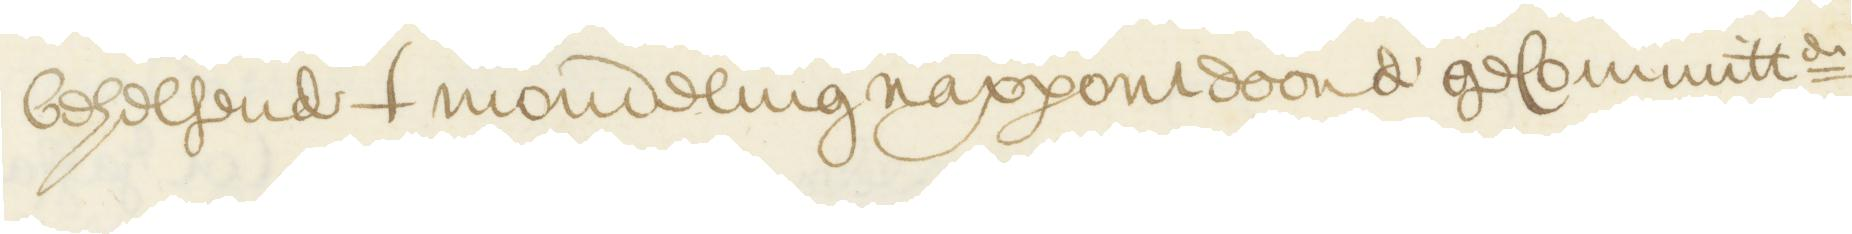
behelsende 't mondeling rapport door de' geCommitt=en
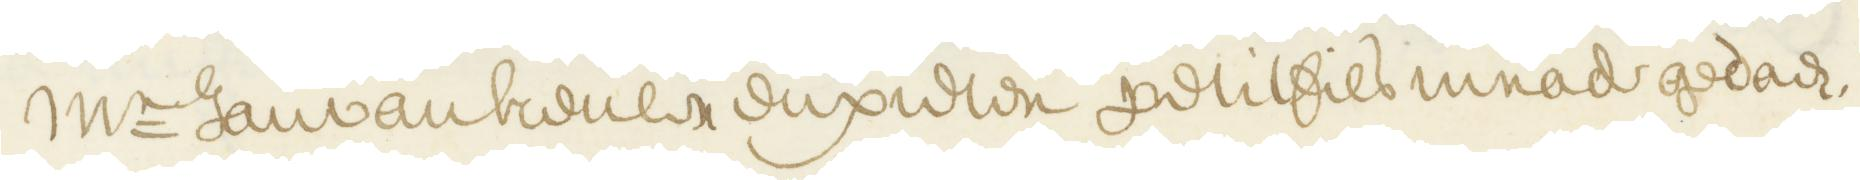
M=r Janvankeulen enpieter petitfils inrade gedaen,
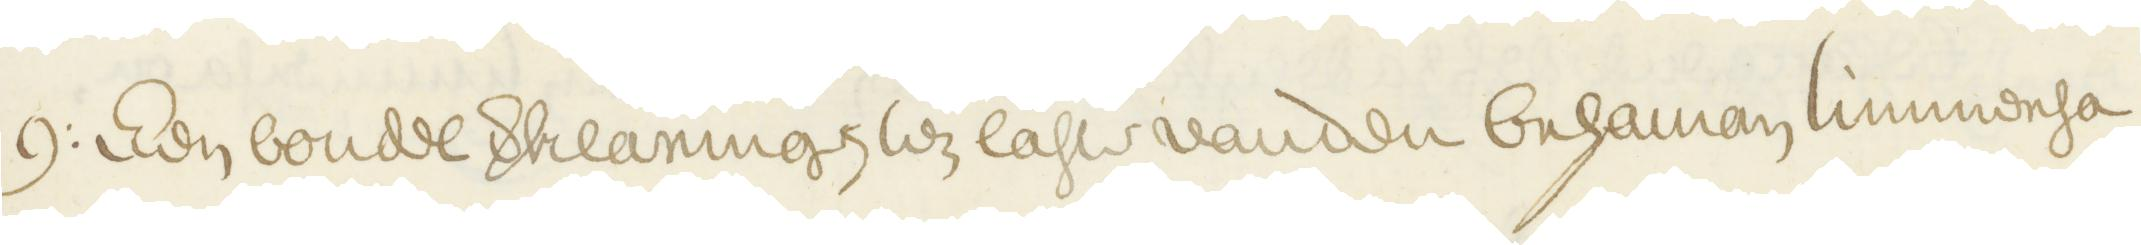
9: Een bondel verklaringen ten laste van den brhaman timmersa
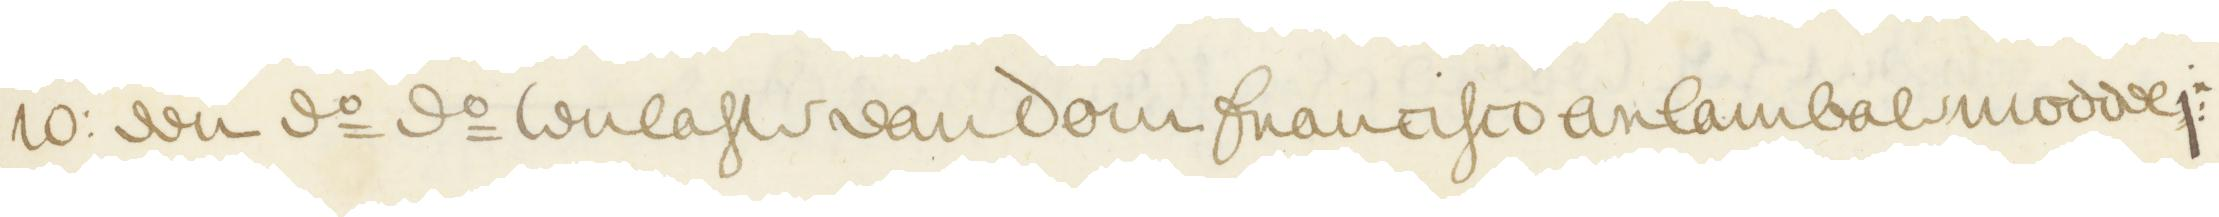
10: een d=o d=o ten laste van dom francisco arlambal moddelj:
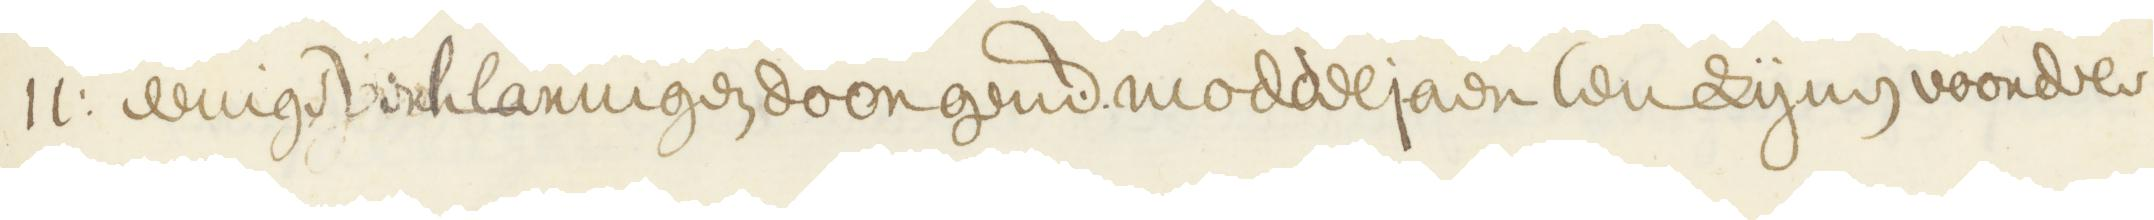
11: eenige verklaringen door gem: moddeljaer tenzijnen voordele
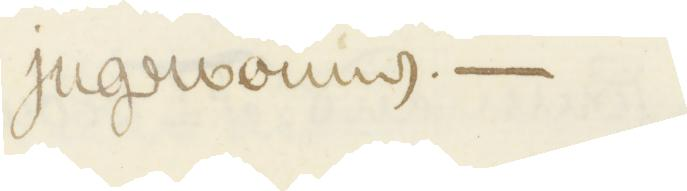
jngewonnen. —
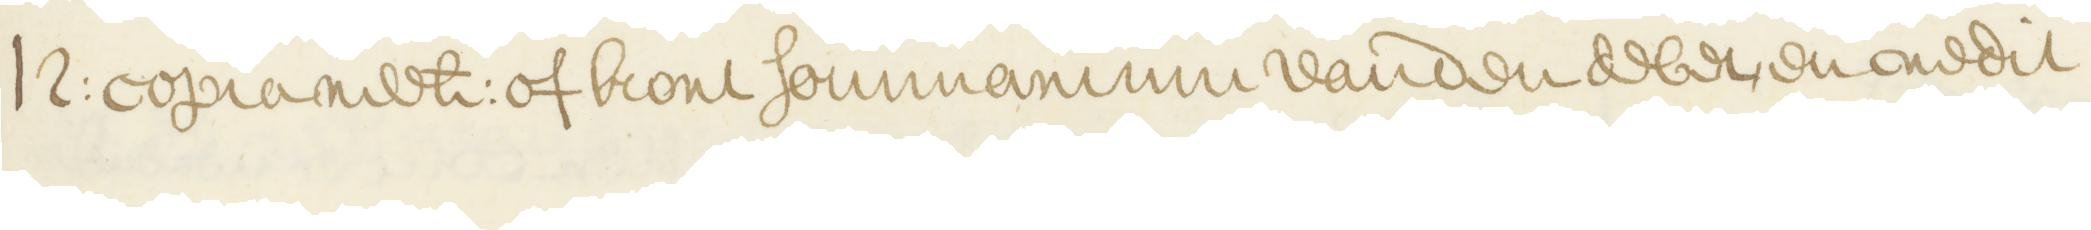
12: copia reek: of kort sommarium vanden debet, en credit
